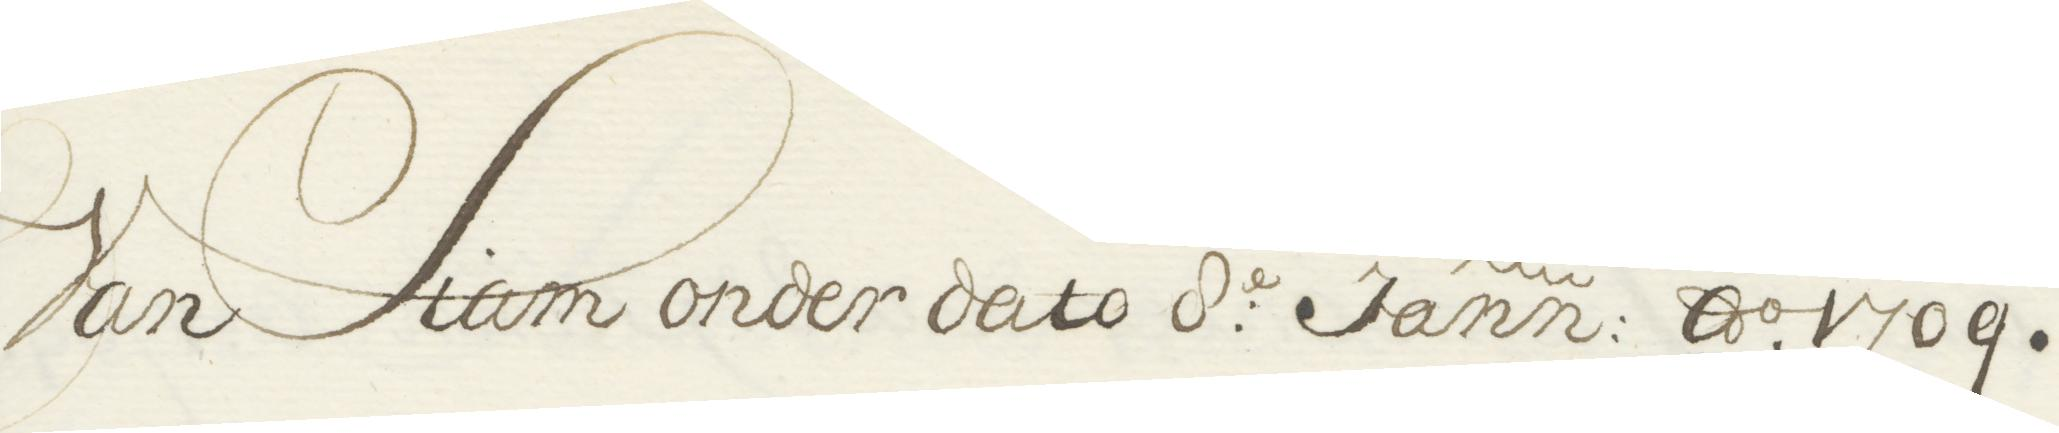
Van Siam onder dato 8:e Jann: A.o 1709.
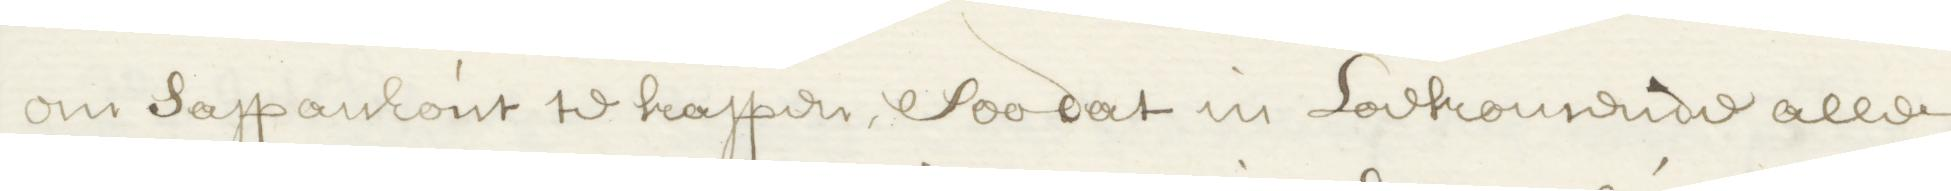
om sappanhout te kappen, soodat in toekomende alle
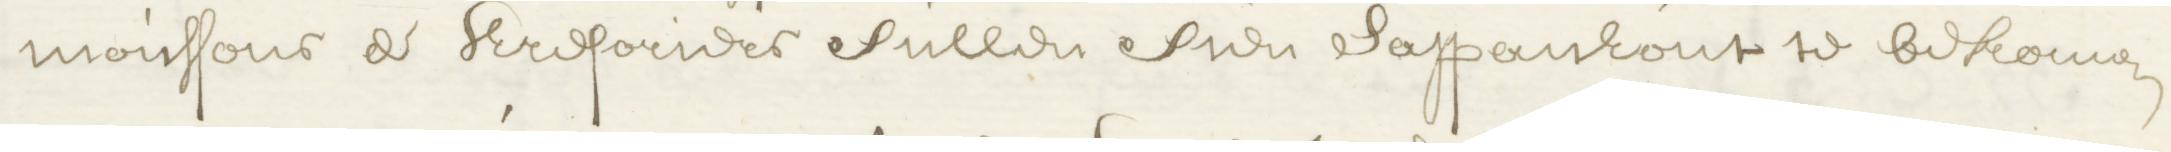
moussons de thresoriers sullen sien sappanhout te bekomen
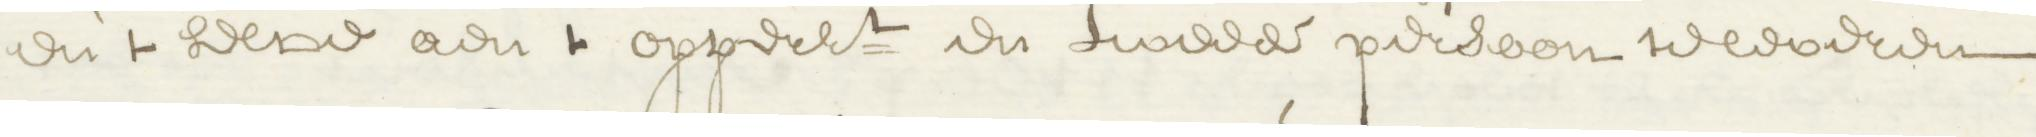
en ’t selve aen ’t opperh=t en tweede persoon te leveren
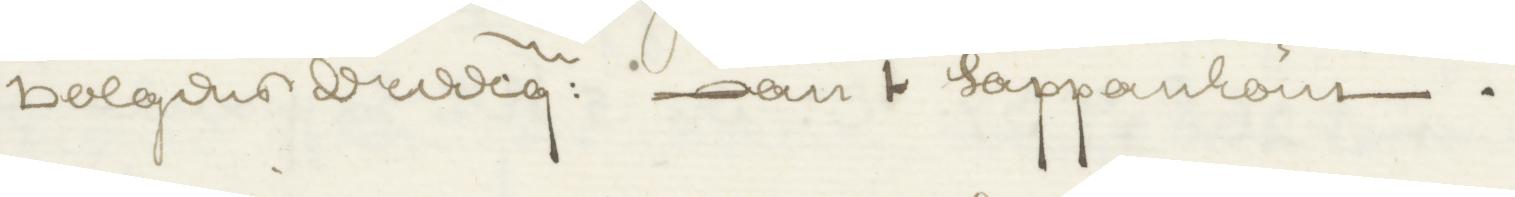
volgens de reecq: van 't sappanhout.
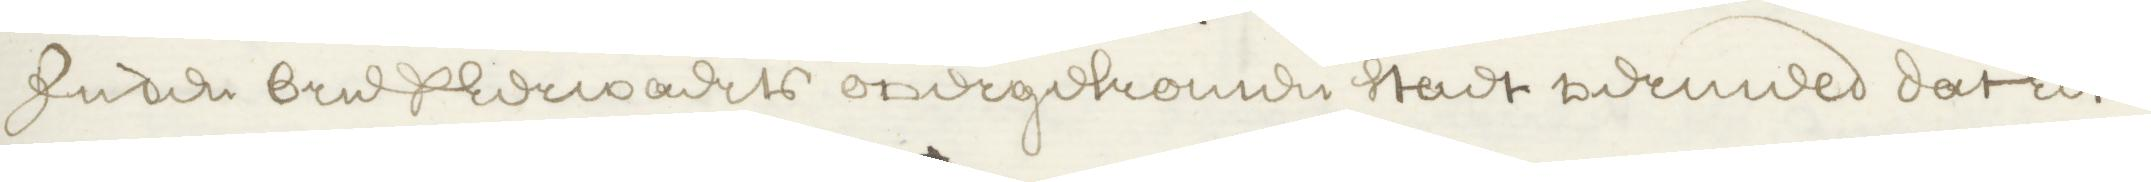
Jnden brief herwaerts overgekomen staet vermeld dat het
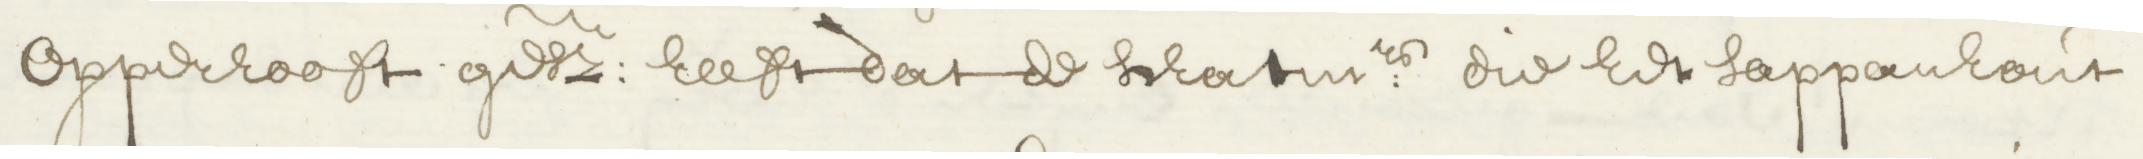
Opperhooft gesz: heeft dat de schatm:rs die het sappanhout
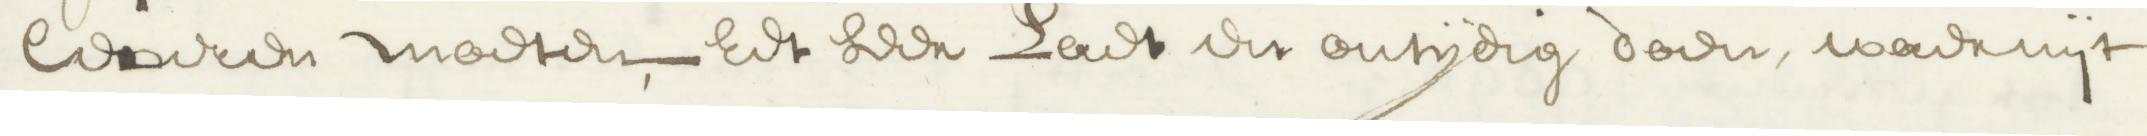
leveren moeten, het seer Laet en ontijdig doen, waeruijt
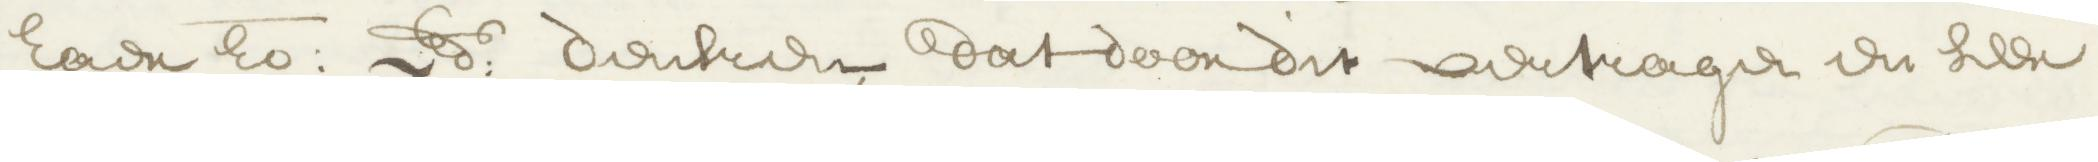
haer ho: Ed:s denken, dat door dit vertragen en seer
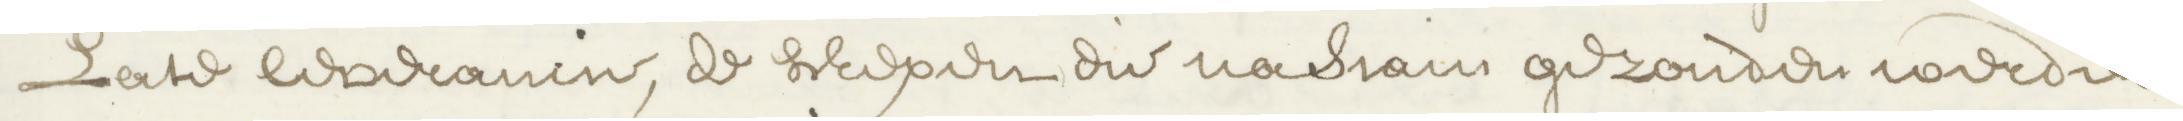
Late leverancie, de schepen die na Siam gezonden werden
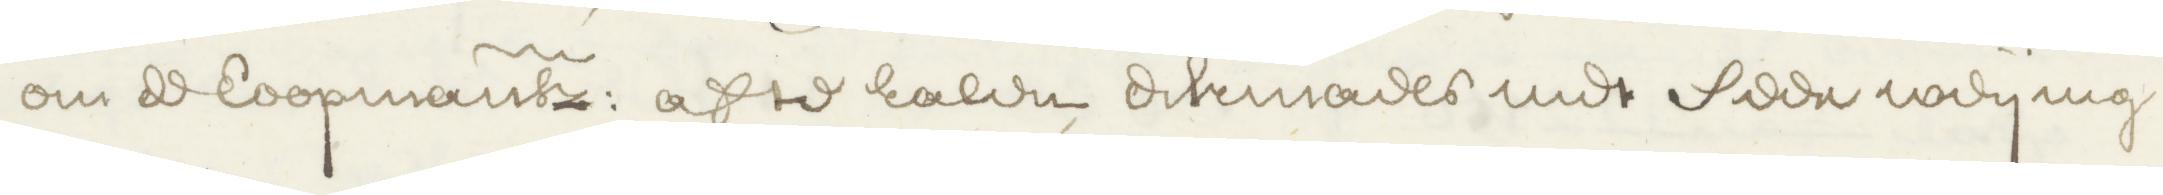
om de coopmansz: afte halen, dikmaels met seer weijnig
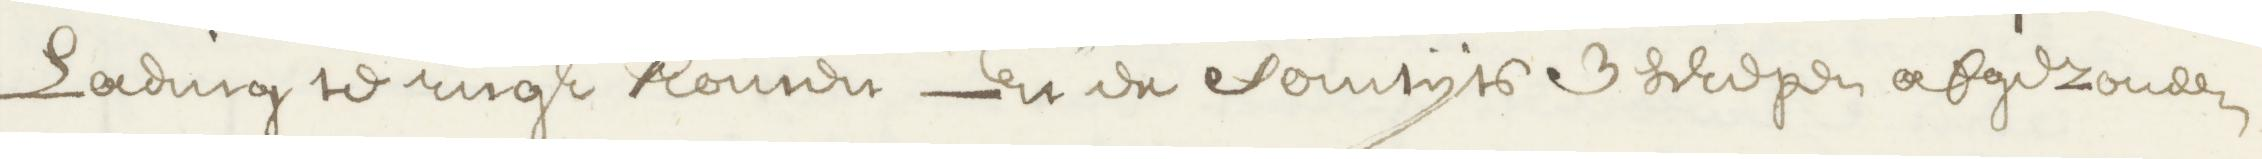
Lading te rugh komen En "er somtijts 3 schepen afgezonden
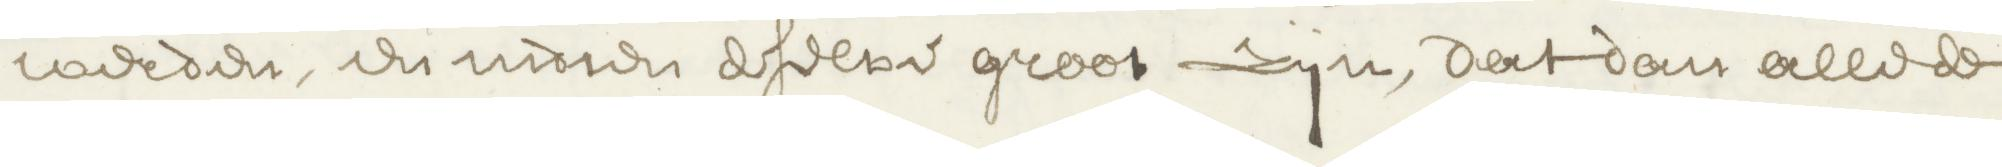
werden, en indien deselve groot zijn, dat dan alle de
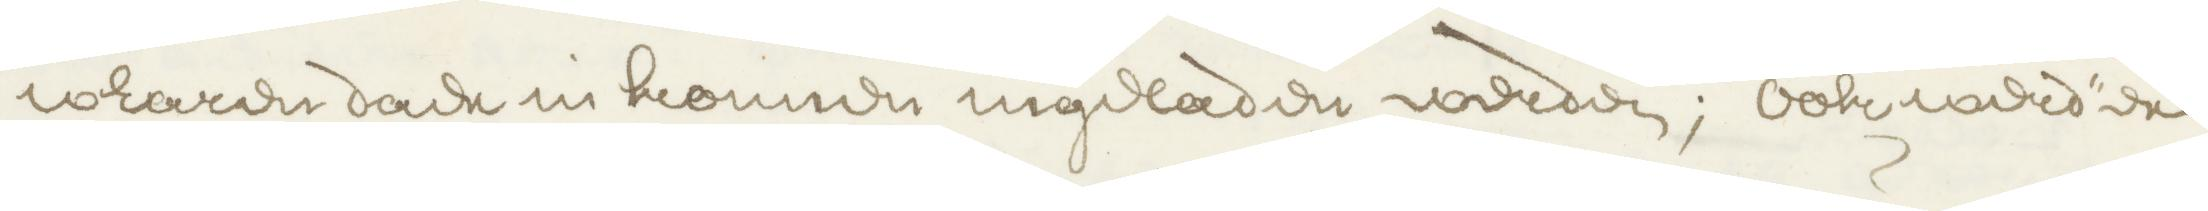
wharen daer in konnen ingeladen werden; ook werd "er
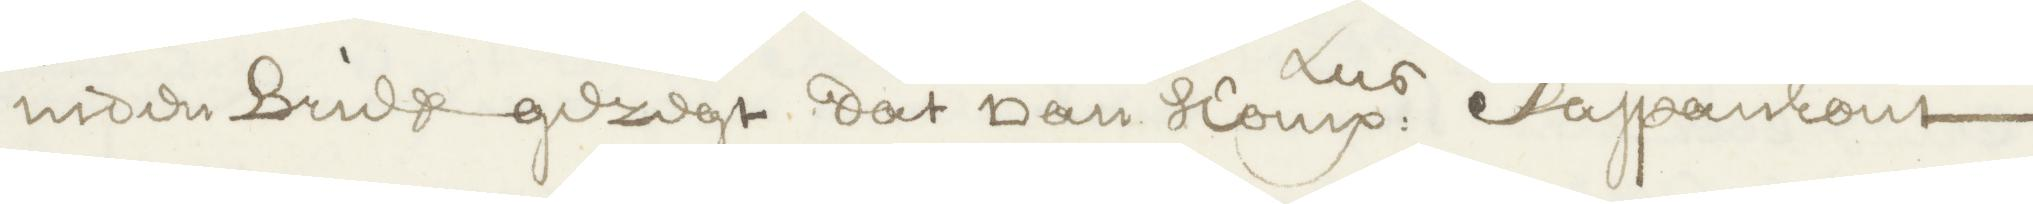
inden Brief gezegt dat van 'sComp:s sappanhout
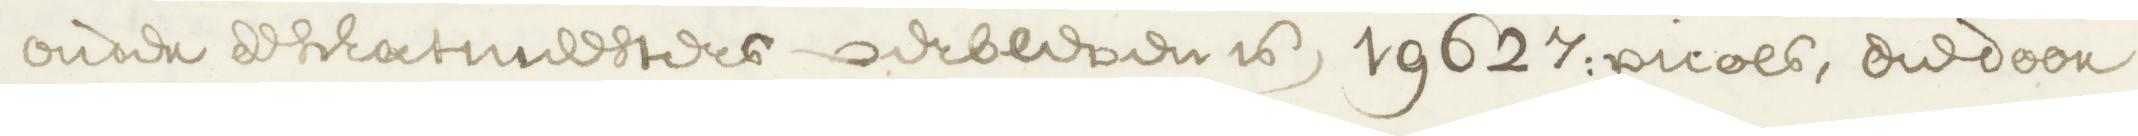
onder de schatmeesters verbleven is, 19627: picols, die door
